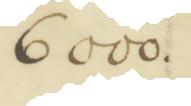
6000.
